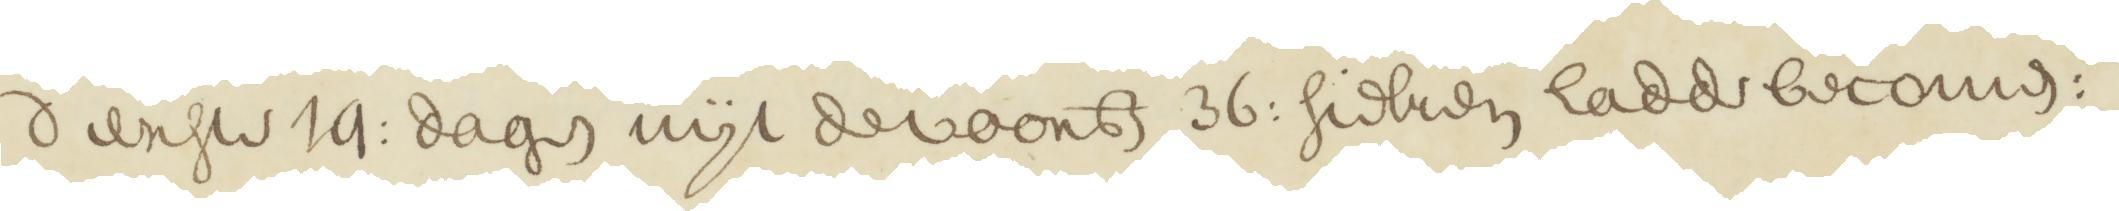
d'erste 14: dagen uijt de voors 36: sieken hadde becomen:
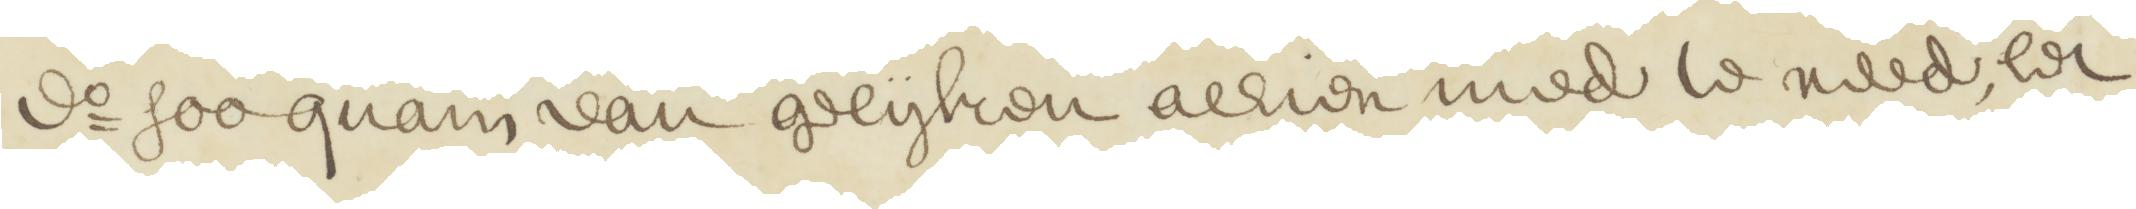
d=o soo quam van gelijken alhier mede te reede, het
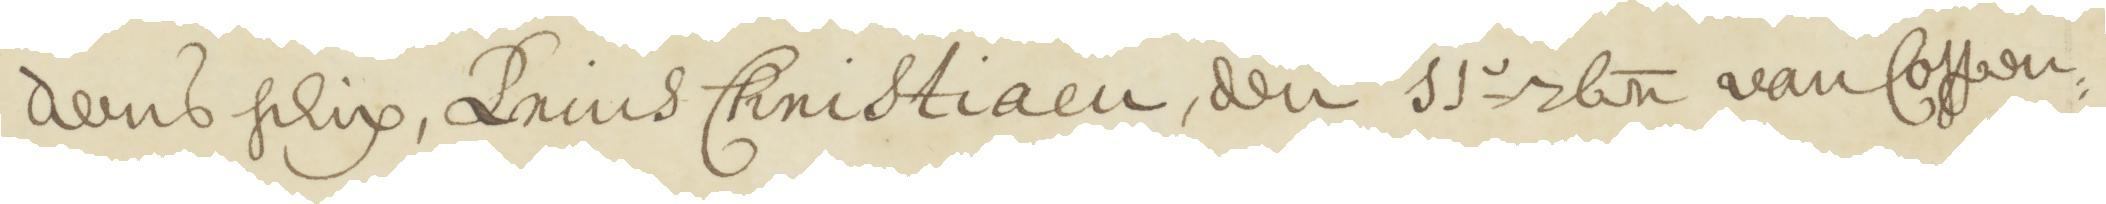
deens schip, Prins Christiaen, den 11-' 7ber van Coppen„
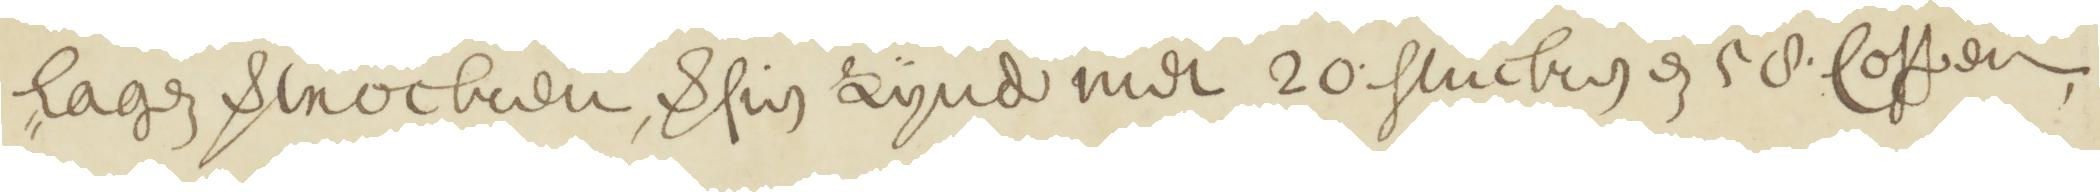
„hagen vertrocken, versien zijnde met 20. stucken en 58. Coppen,
